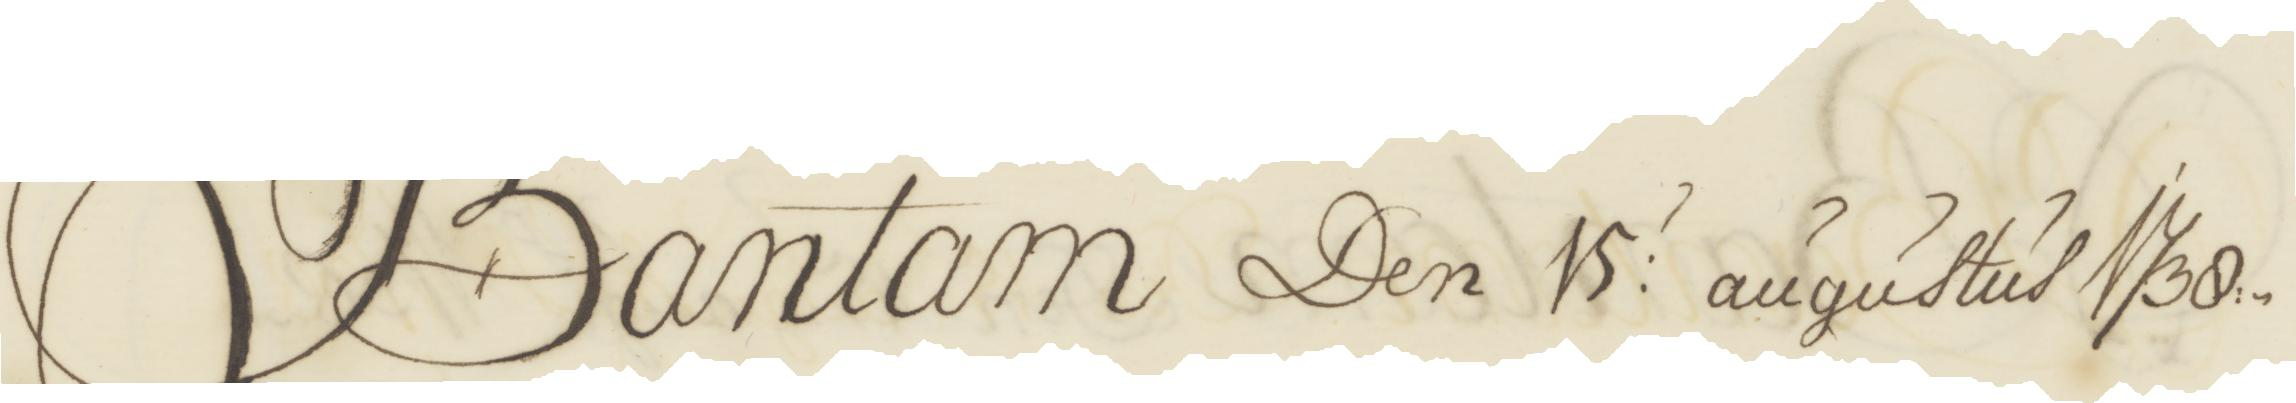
Bantam Den 15:' augustus 1738: -
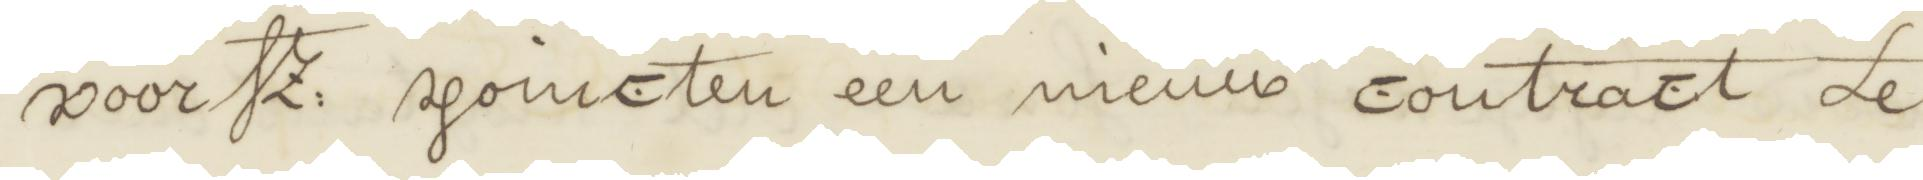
voorsz: poincten een nieuw contract te
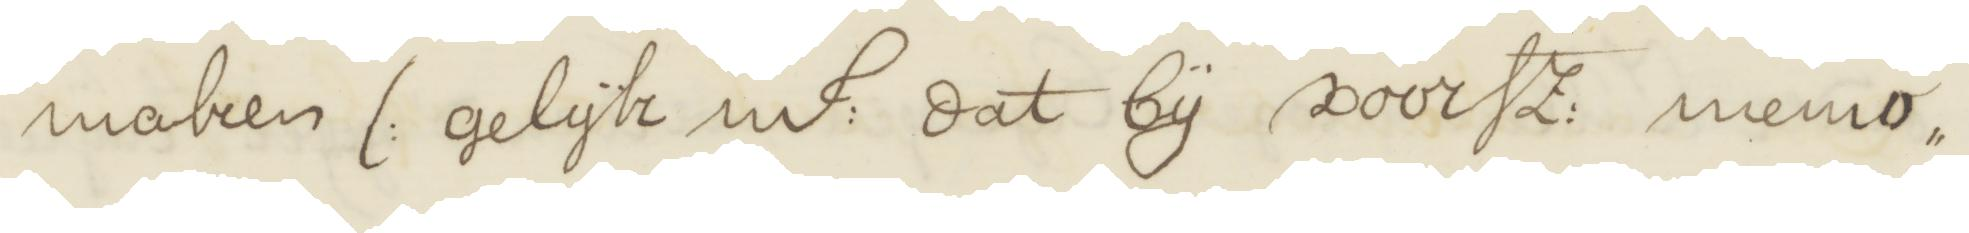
maken (: gelijk uE: dat bij voorsz: memo„
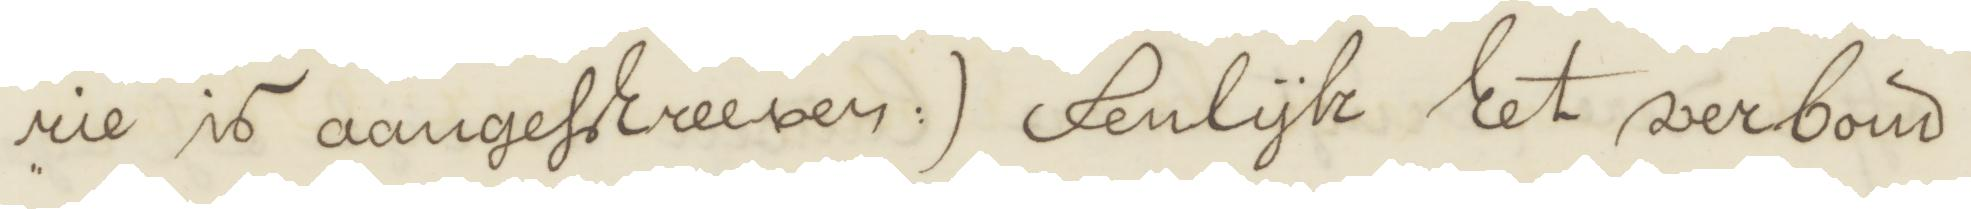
„rie is aangeschreeven:) Eenlijk het verbond
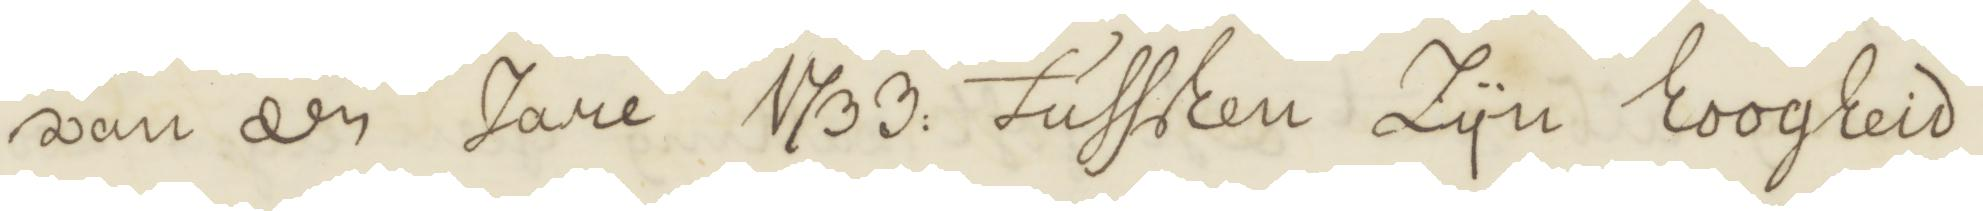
van den Jare 1733: tusschen Zijn hoogheid
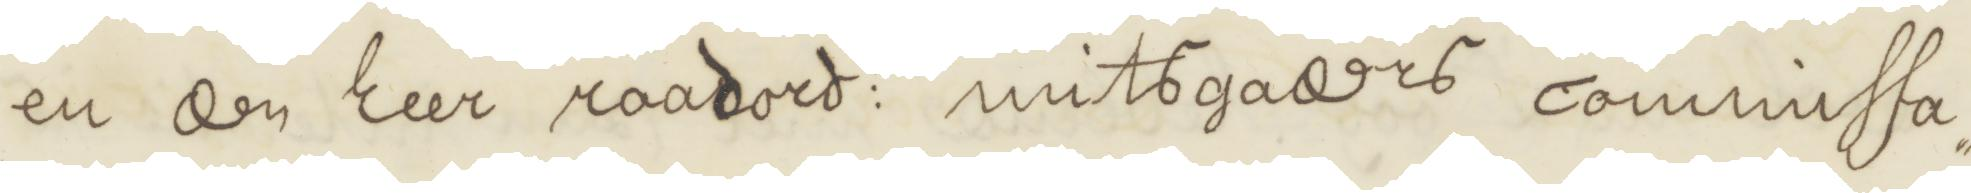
en den heer raadord:s mitsgaders commissa
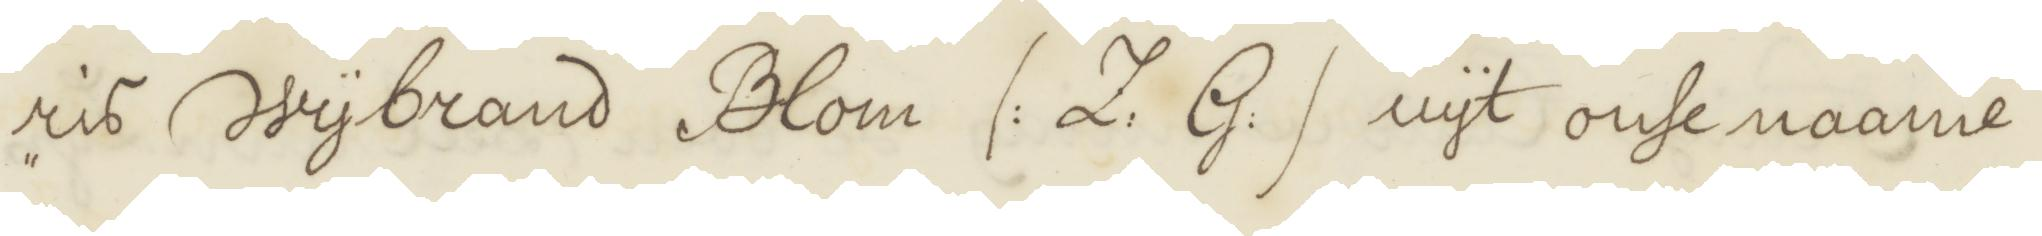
„ris Wijbrand Blom (:Z: G: ) uijt onse naame
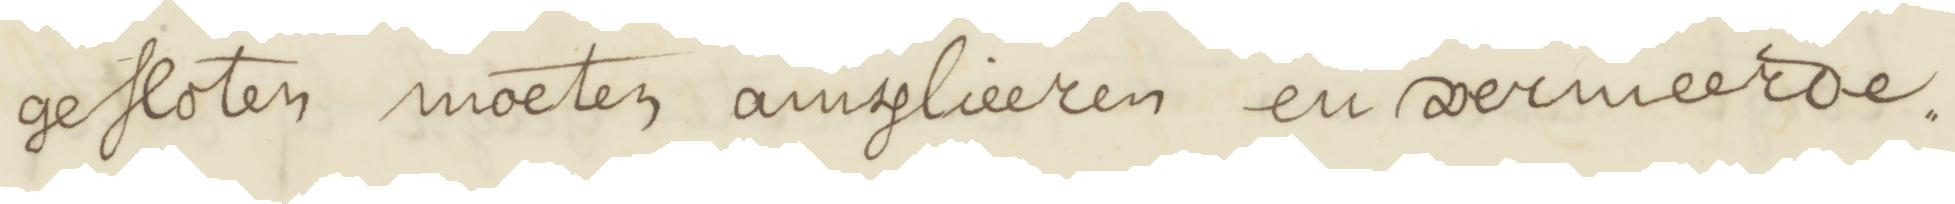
gesloten moeten amplieeren en vermeerde„
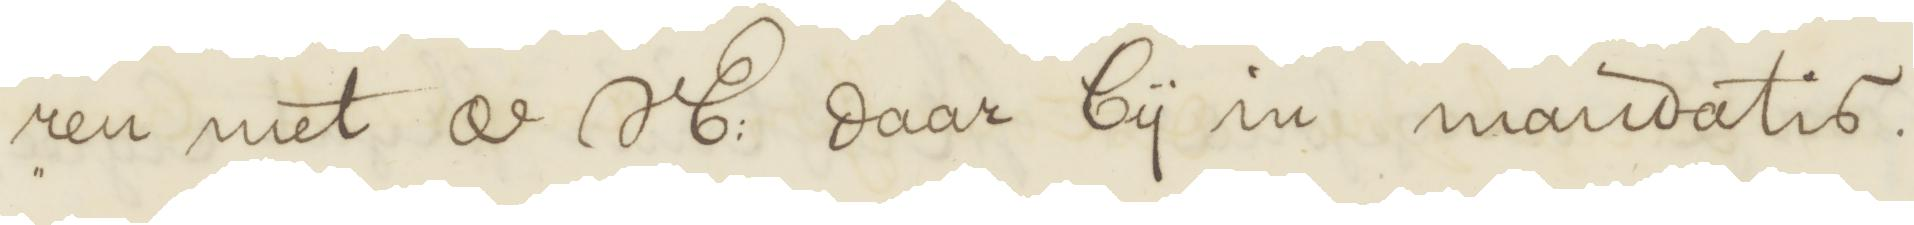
„ren met de VE: daar bij in mandatis.
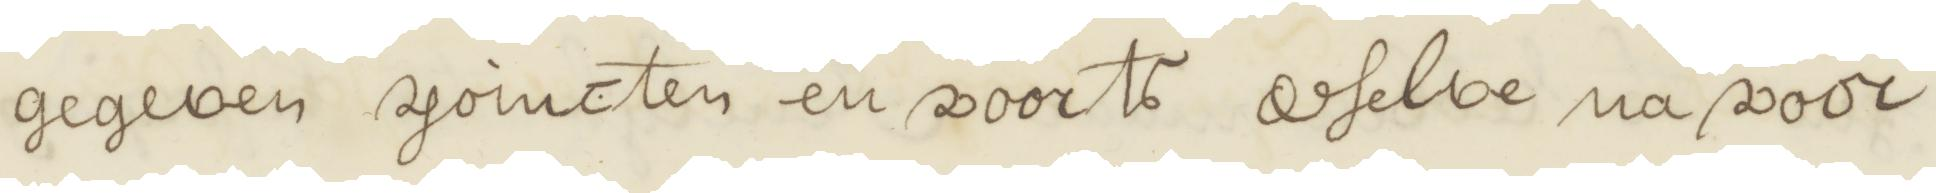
gegeven poincten en voorts deselve na voor
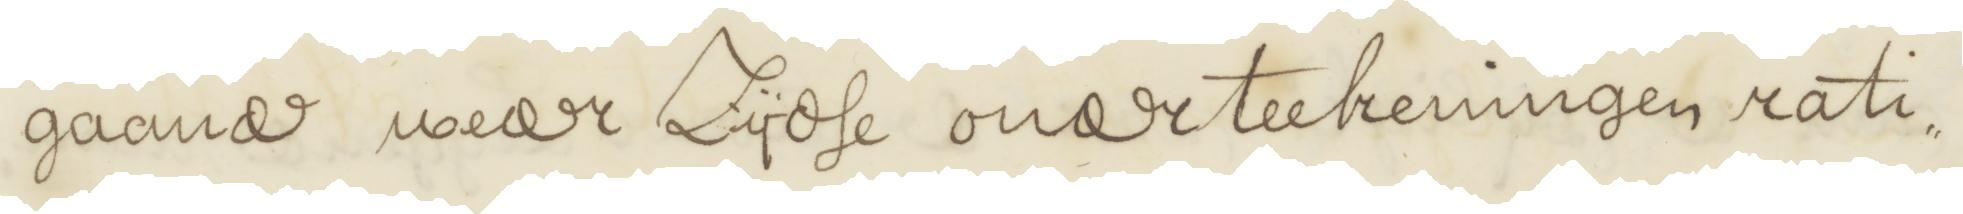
gaande weder Zijdse onderteekeningen rati„
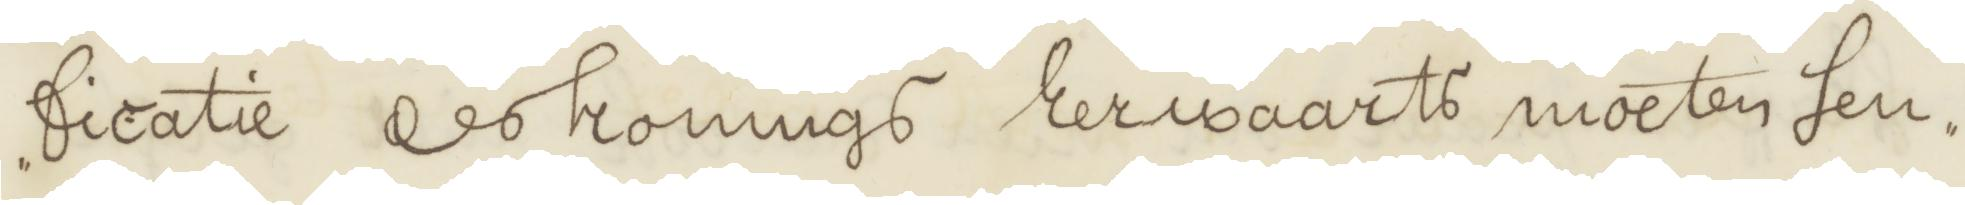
„ficatie des konings herwaarts moeten Sen„
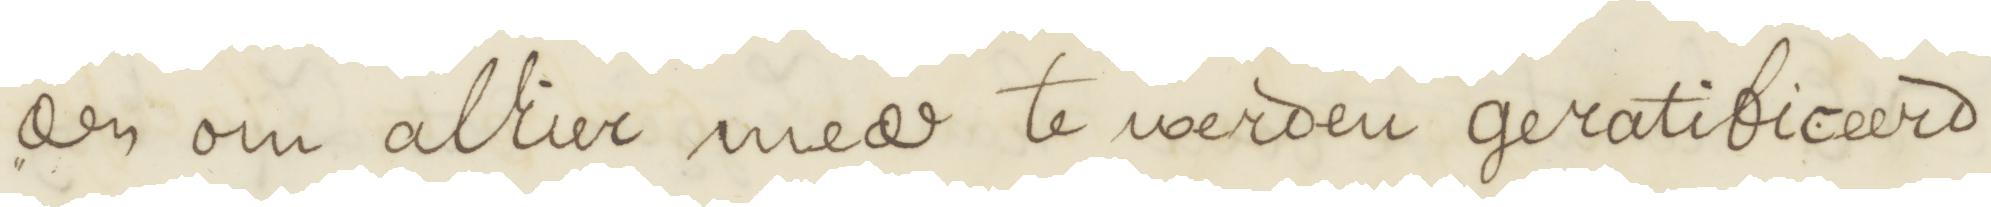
„den om alhier mede te werden geratificeerd
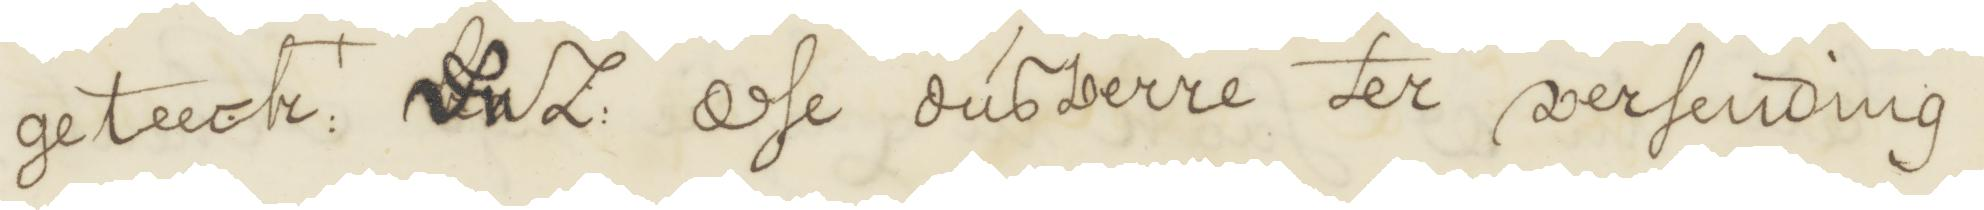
geteeck:t Enz: dese dusverre ter versending
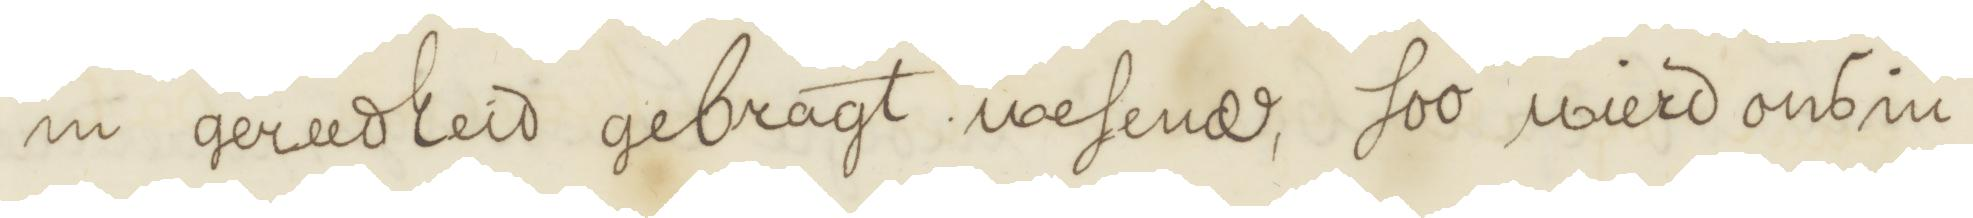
in gereedheid gebragt wesende, soo wierd ons in
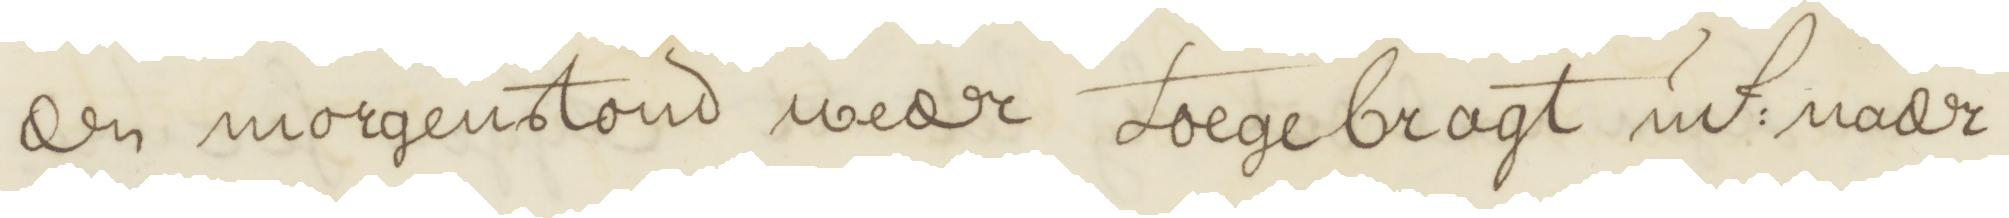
den morgenstond weder toegebragt uE: nader
